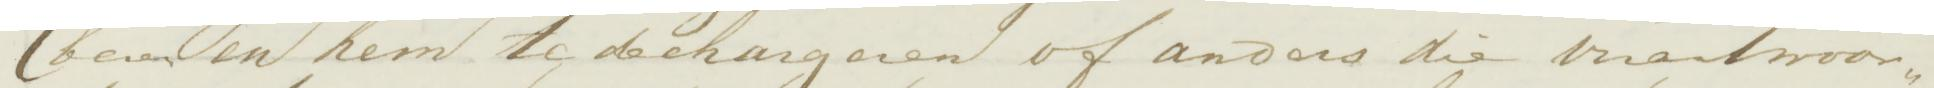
beren en hem te dechargeren of anders die verantwoor„
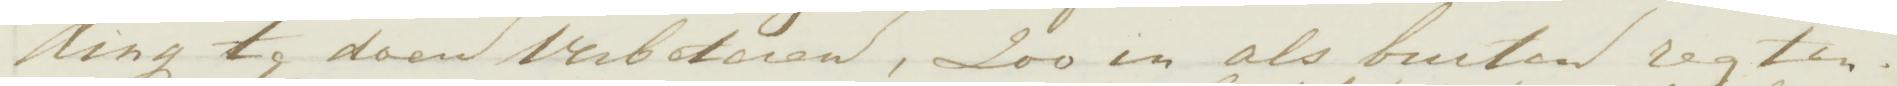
ding te doen verbeteren, zoo in als buiten regten.
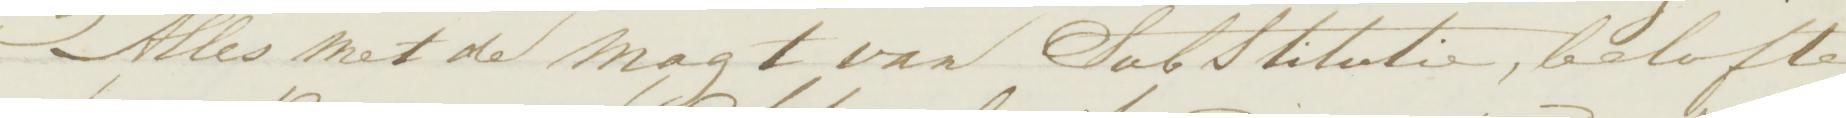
Alles met de magt van Substitutie, belofte
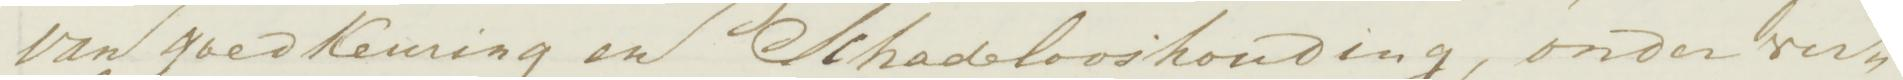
van goedkeuring en Schadelooshouding, onder ver„
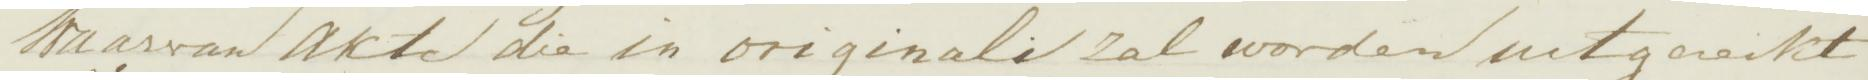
Waarvan Akte die in originali zal worden uitgereikt
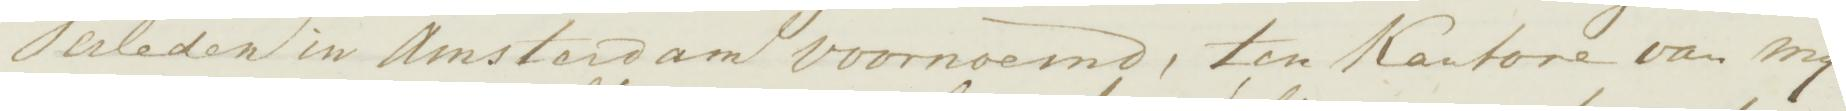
Verleden in Amsterdam voornoemd, ten Kantore van my
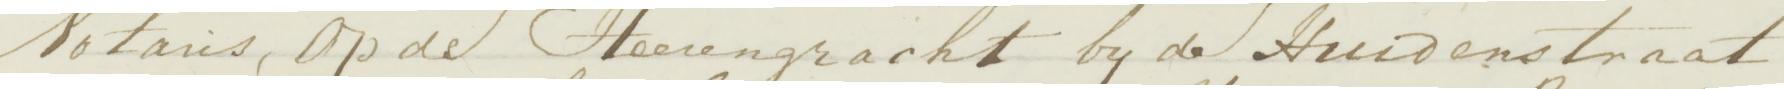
Notaris, Op de Heerengracht by de Huidenstraat
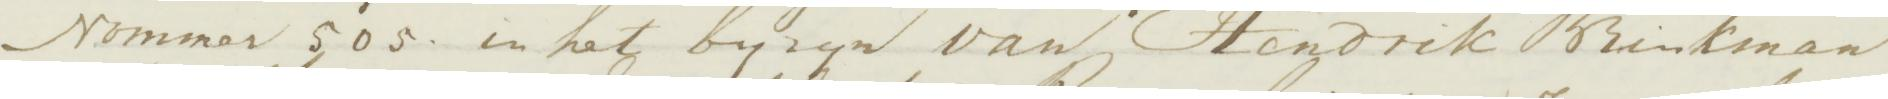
Nommer 505. in het byzyn van Hendrik Brinkman
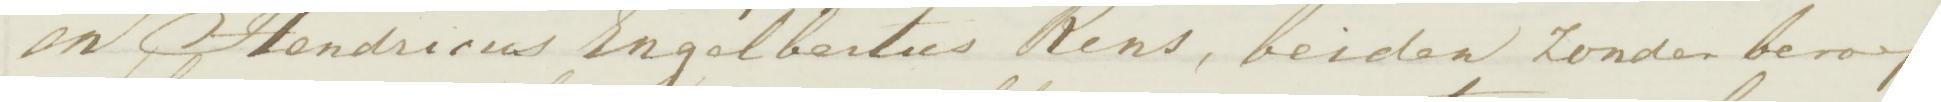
en Hendricus Engelbertus Rens, beiden zonder beroep
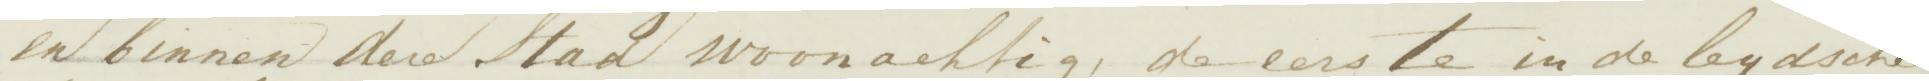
en binnen deze stad woonachtig, de eerste in de leydsche
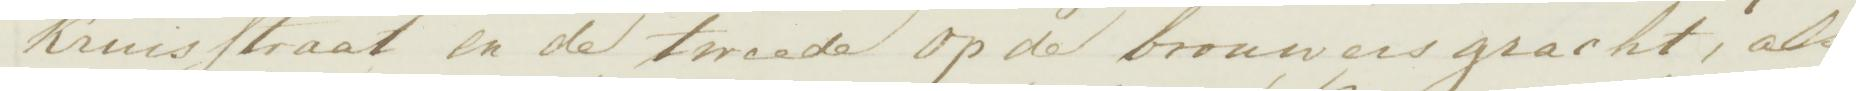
Kruisstraat en de tweede op de brouwers gracht, als
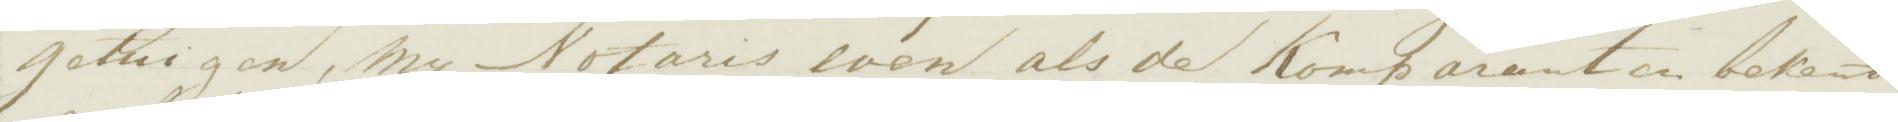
getuigen, my Notaris even als de Komparanten bekend
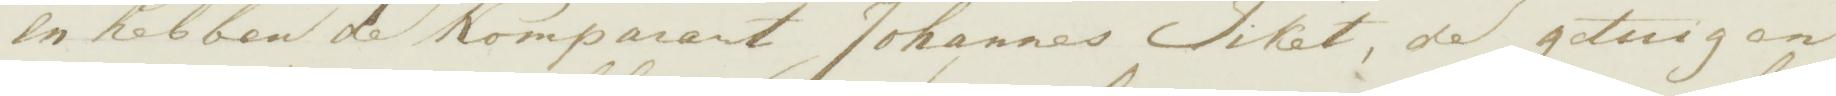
en hebben de Komparant Johannes Tiket, de getuigen
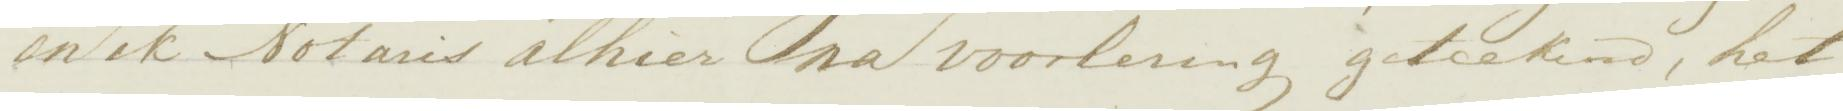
en ik Notaris alhier na voorlezing geteekend, het
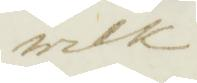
welk
